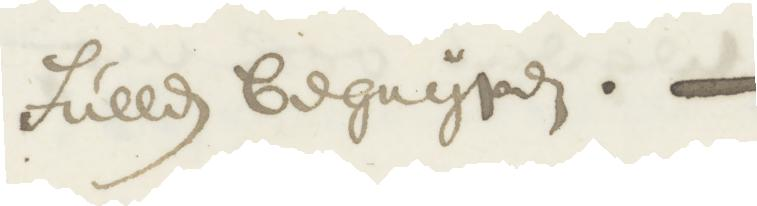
sullen begrijpen.—
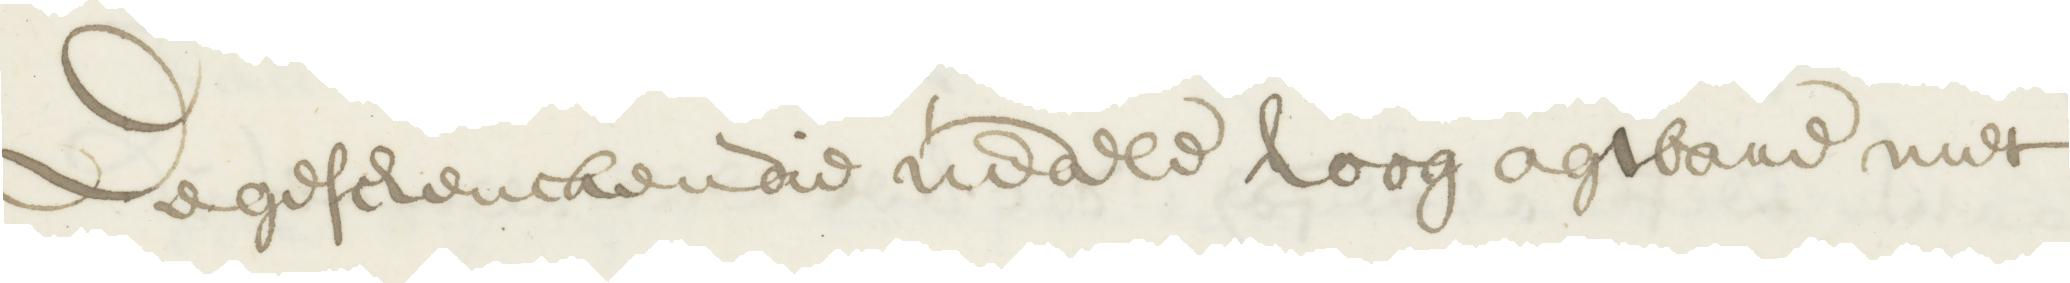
De geschencken die u Edele hoog agtbare met
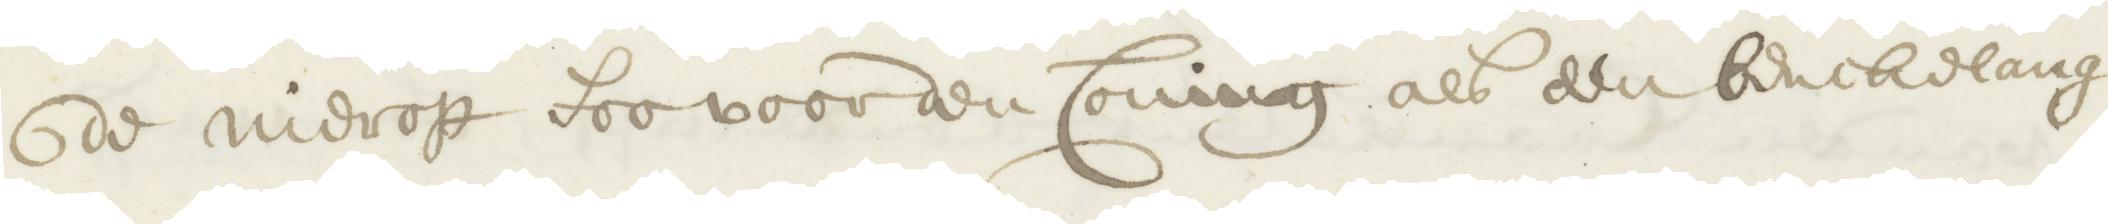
de nierop soo voor den Coning als den berckelang
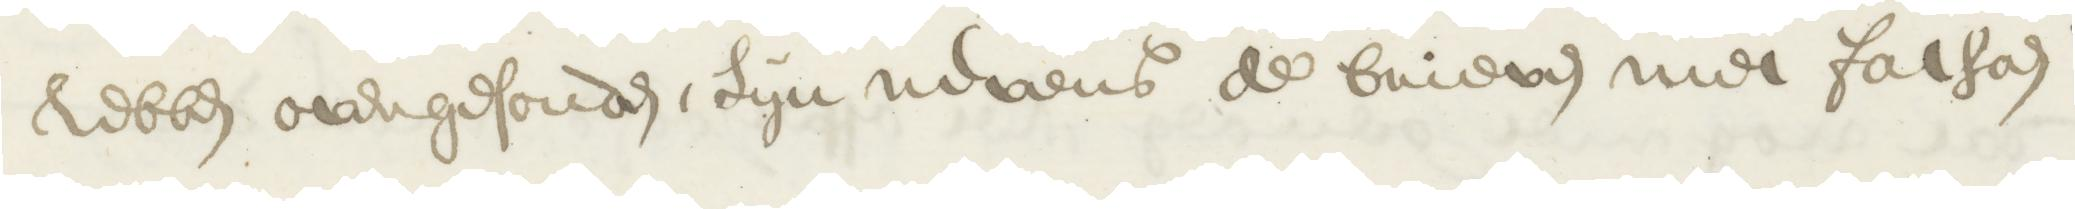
hebben over gesonden, sijn nevens de brieven met fatsoen
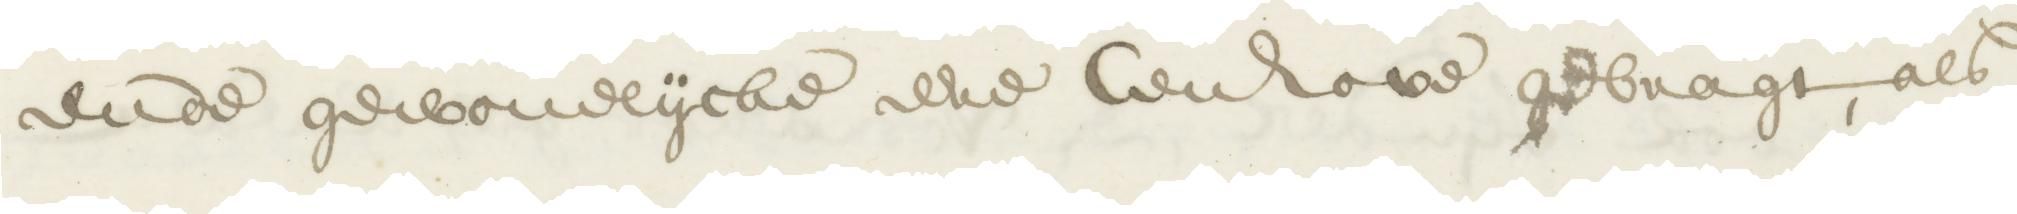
ende gewonelijcke ere tenhove gebragt, als
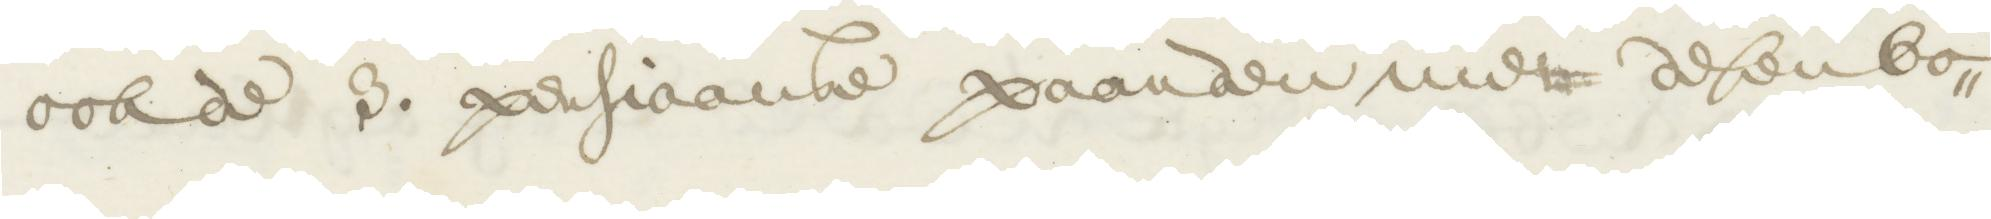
ook de 3. persiaanse paarden met desen bo„
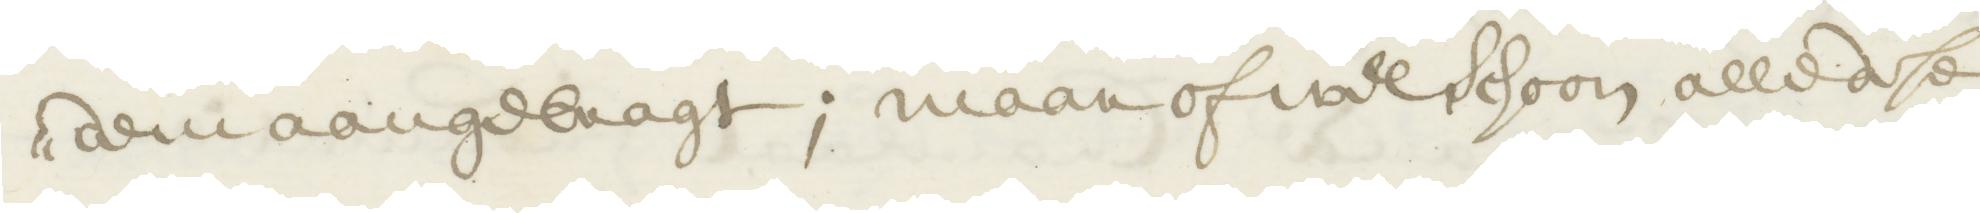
„dem aangebragt; maar of wel schoon alle dese
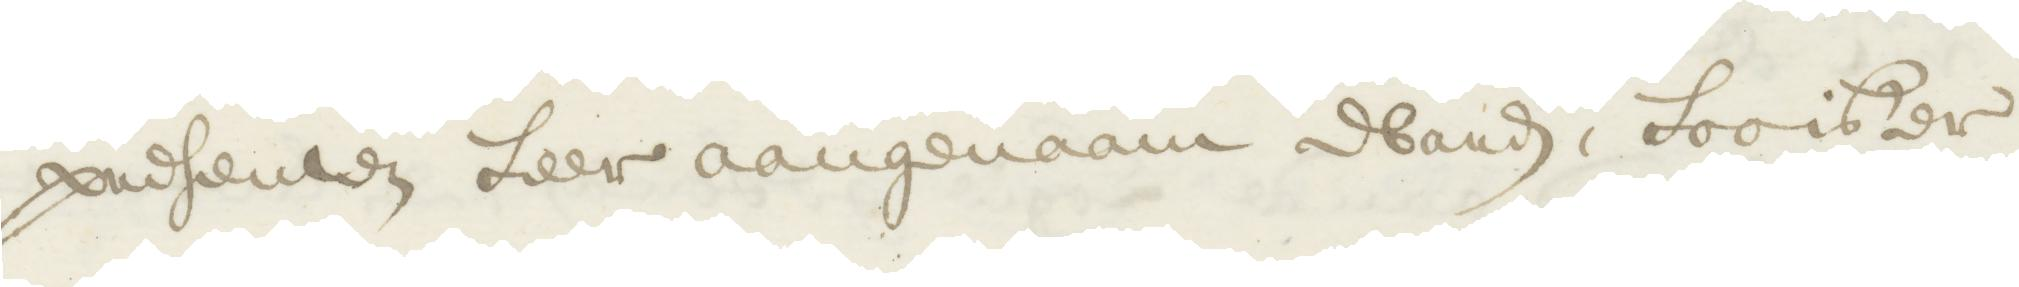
presenten seer aangenaam waren, soo is 'er
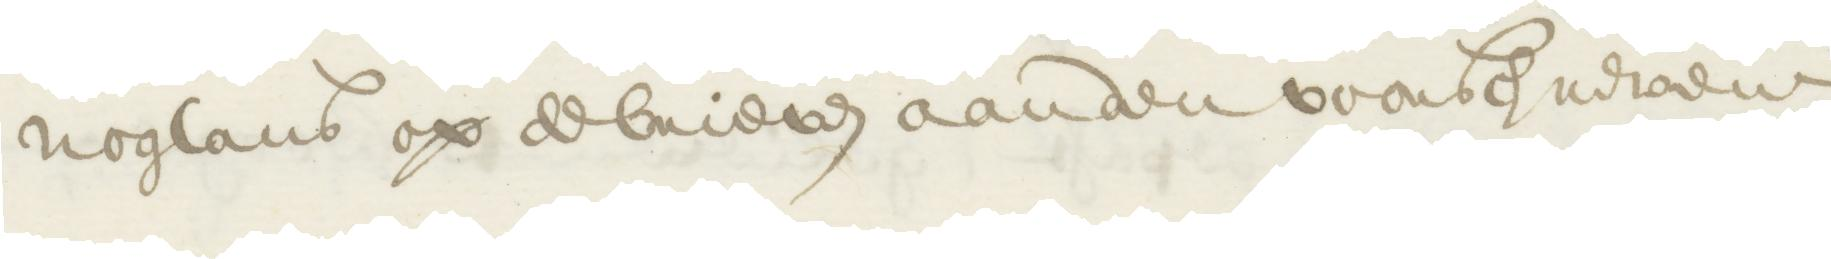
nogtans op de brieven aan den voorschreven
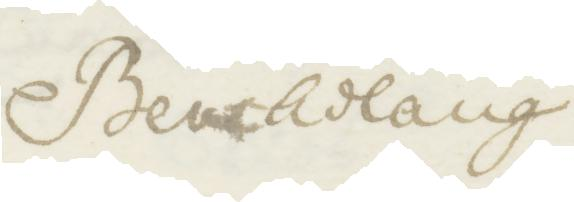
Berckelang
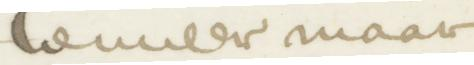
temeer maar
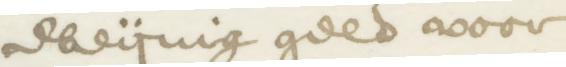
weijnig goed voor
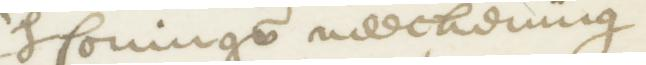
's Conings reeckening
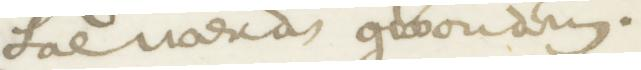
sal werde gesonden.
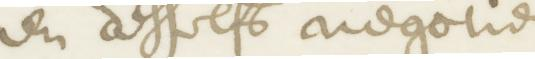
en desselfs negotie
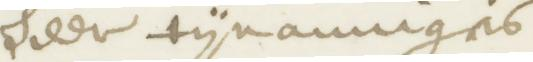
seer tijrannig is
